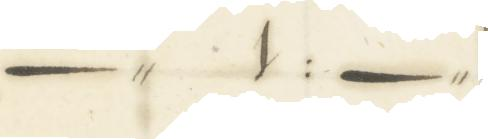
—„ 1: —„
